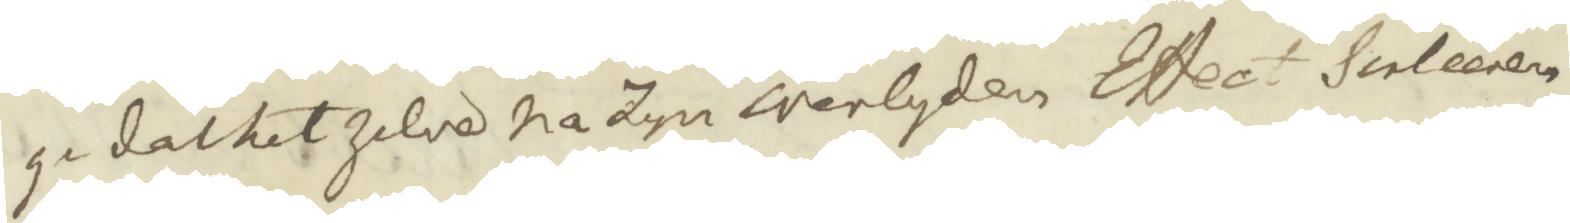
ge dat het zelve na zyn overlyden Effect sorteeren
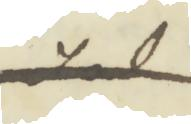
zal
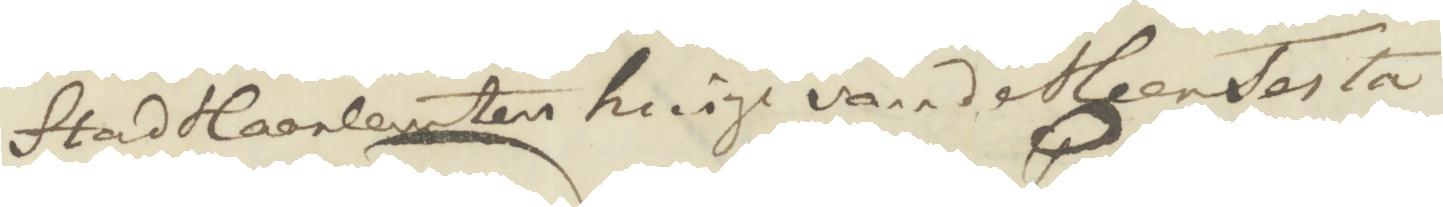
stad Haarlem ten huize van de Heer Testa
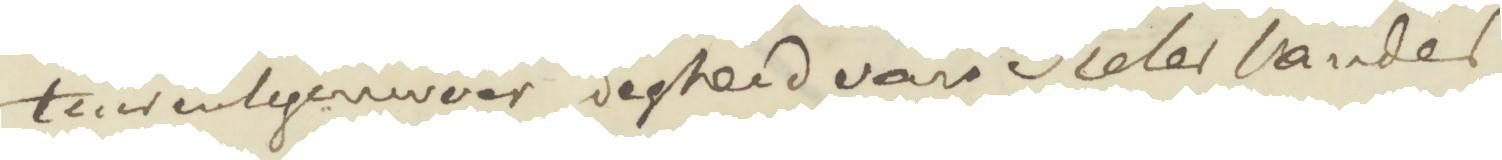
teur in tegenwoordigheid van Pieter van der
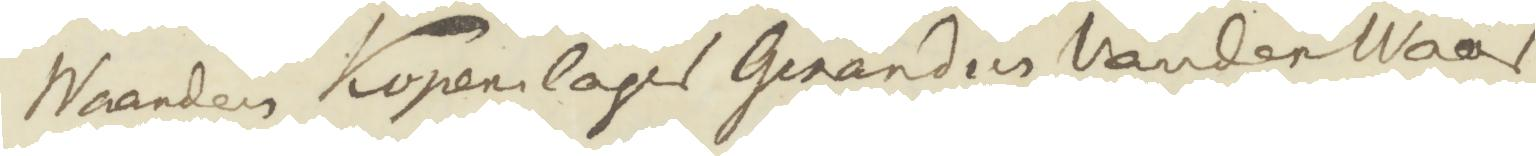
Waarden Koperslager Gerardus van der Waar
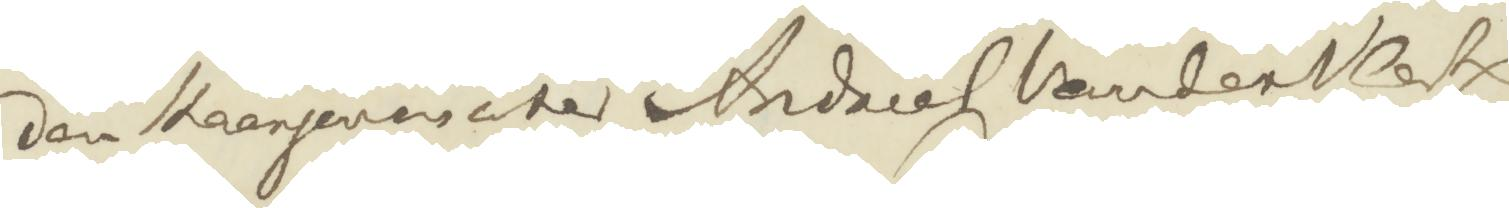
den Kaarsenmaker Andries van der Vlerk
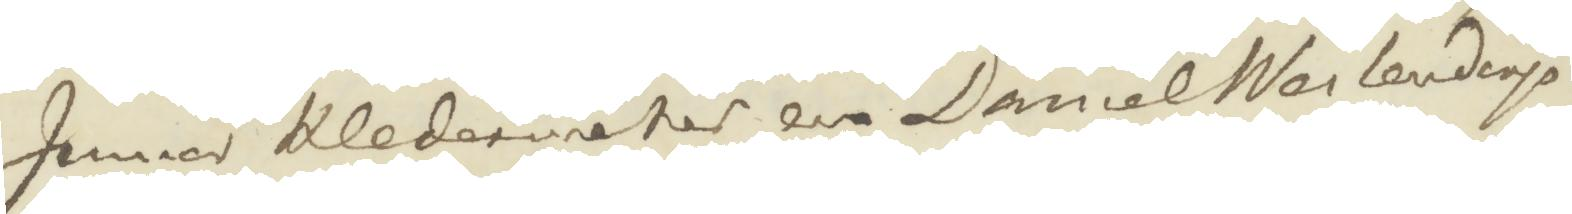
Junior Kledermaker en Daniel Westerdorp
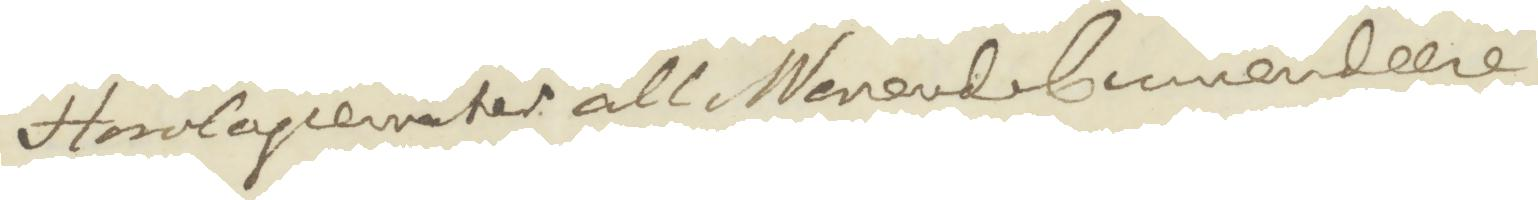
Horologiemaker alle Wonende binnen deese
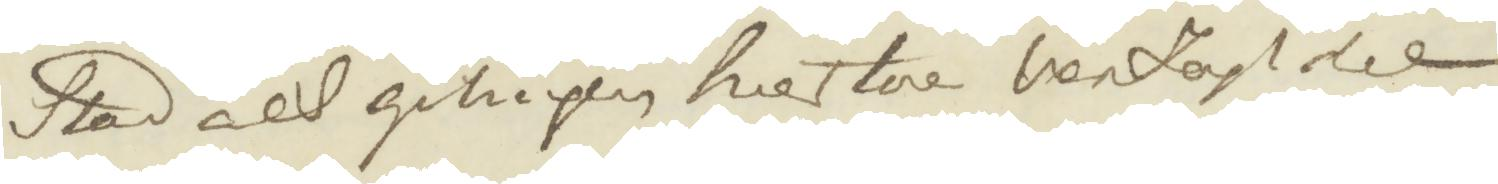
Stad als getuigen hiertoe verzogt die
